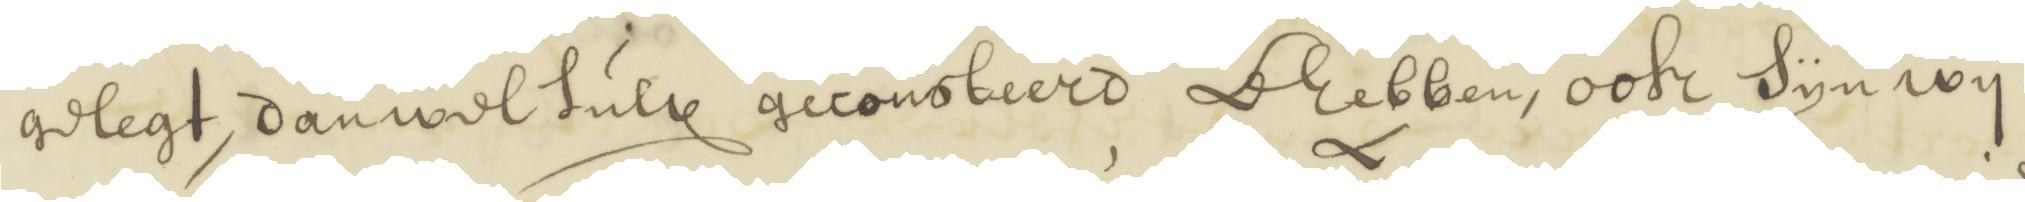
gelegt, dan wel sulx geconsteerd te hebben, ook sijn wij
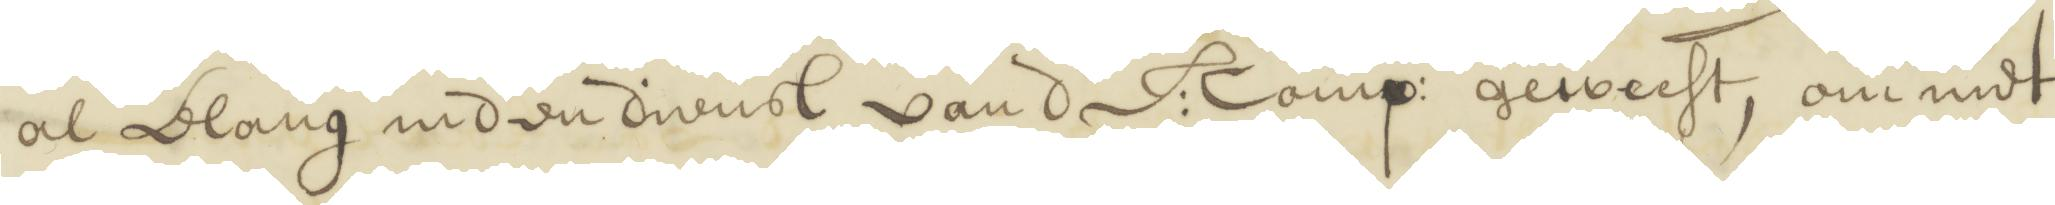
al te lang in den dienst van d' E: Comp: geweest, om niet
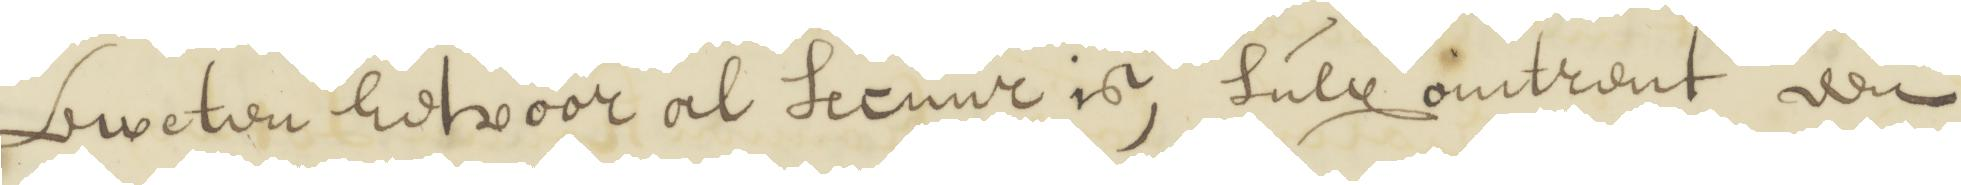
te weten het voor al secuur is, sulx omtrent een
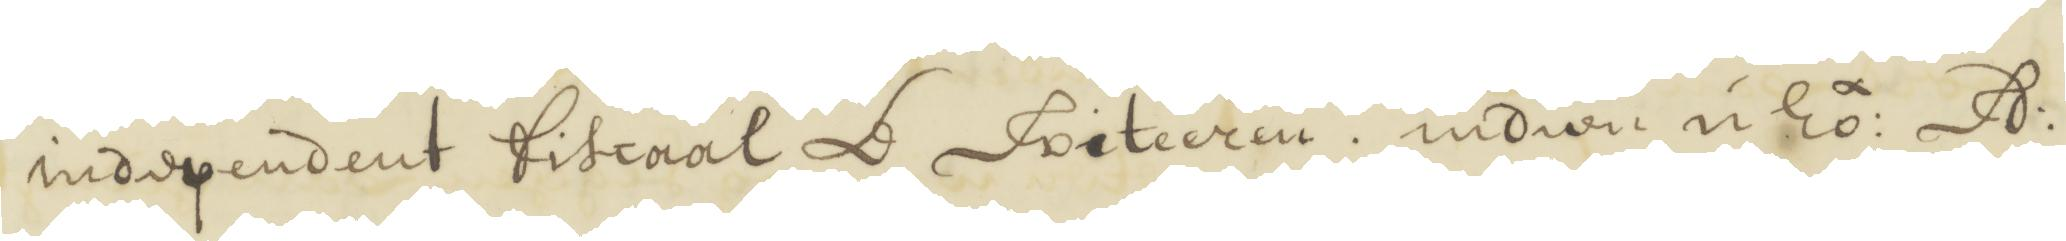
independent fiscaal te Eviteeren indien u ho: Ed
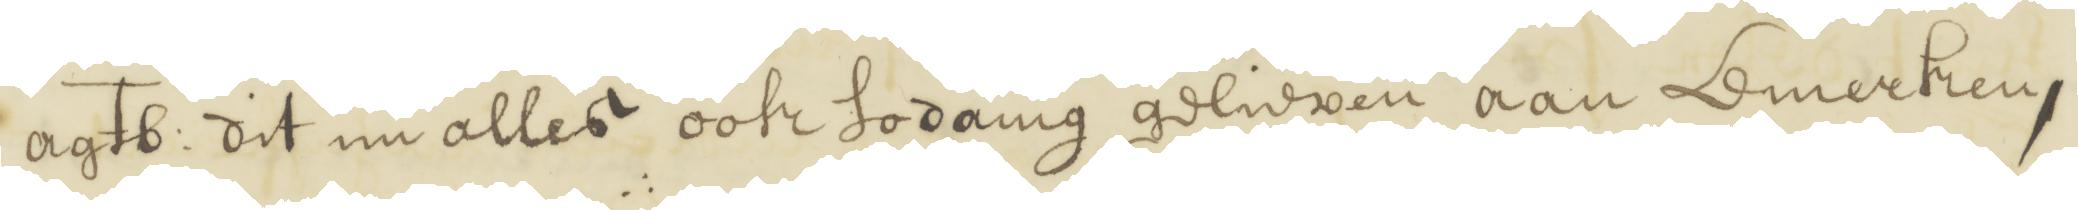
agtb: dit nu alles ook sodanig gelieven aan te merken,
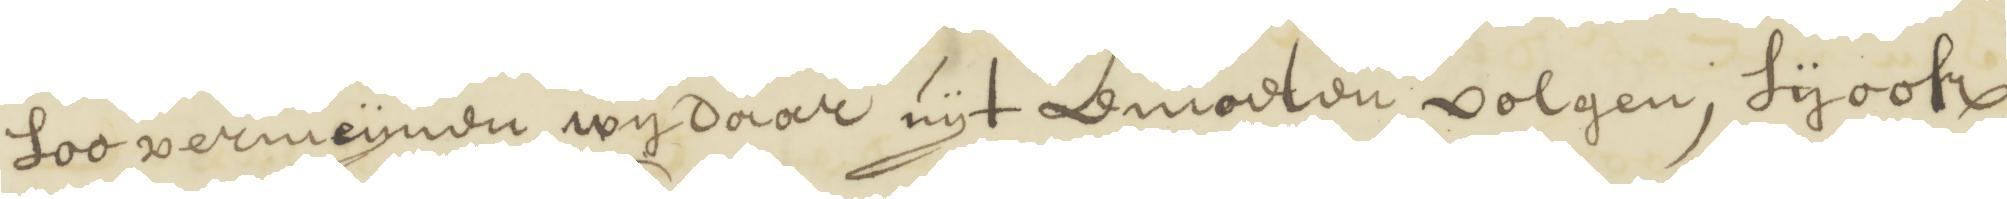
soo vermeijnen wij daar uijt te moeten volgen, sij ook
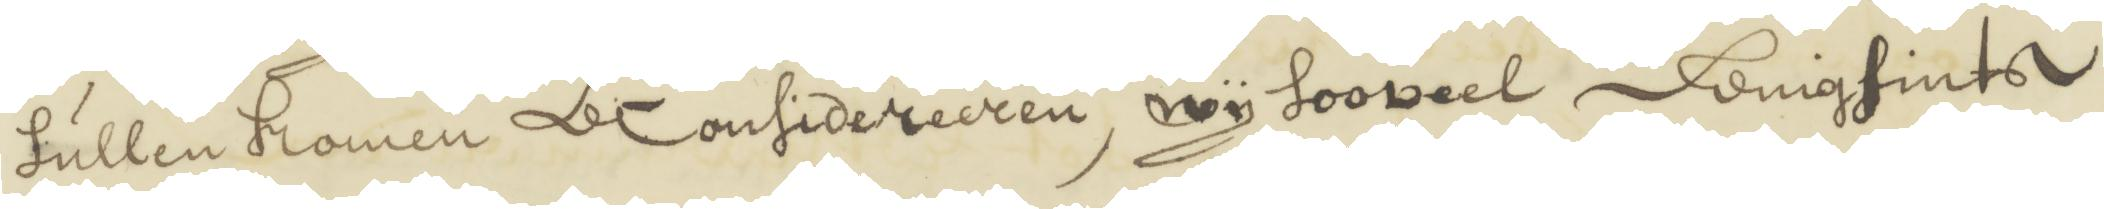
sullen komen te Considereeren, wij sooveel Eenigsints
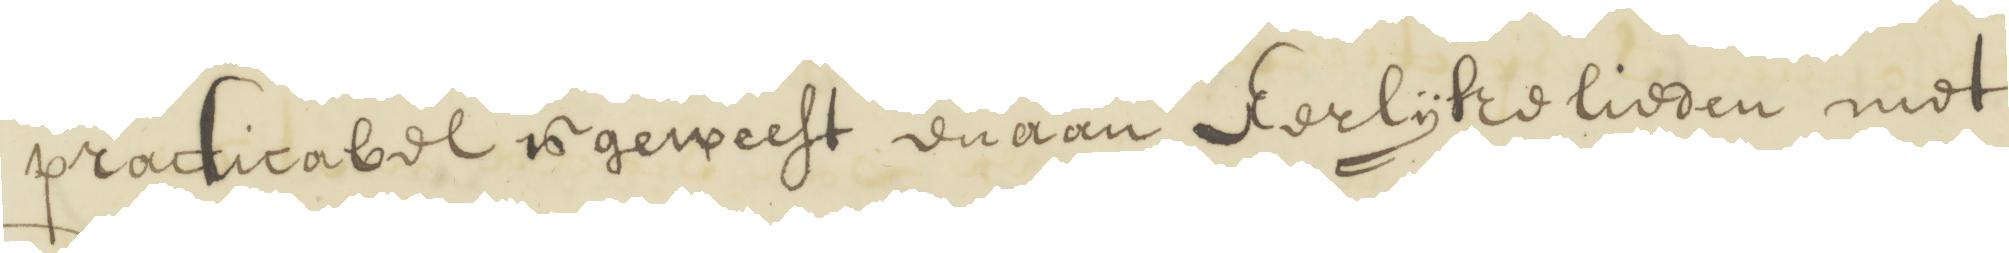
practicabel is geweest en aan Eerlijke lieden met
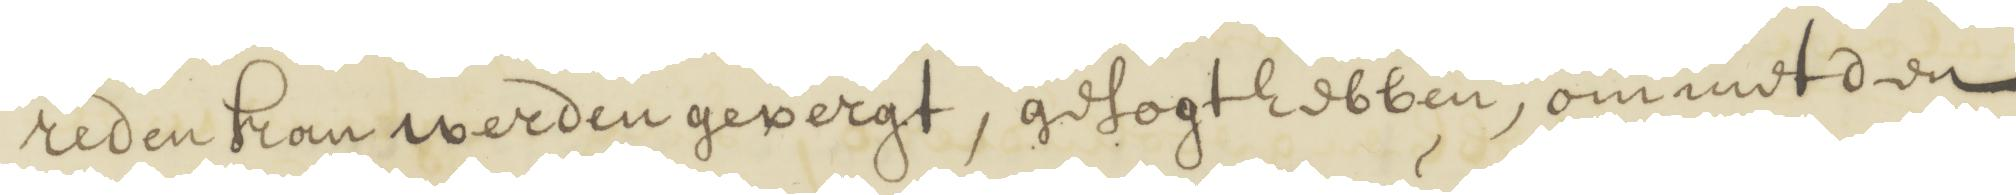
reden kan werden gevergt, gesogt hebben, om met den
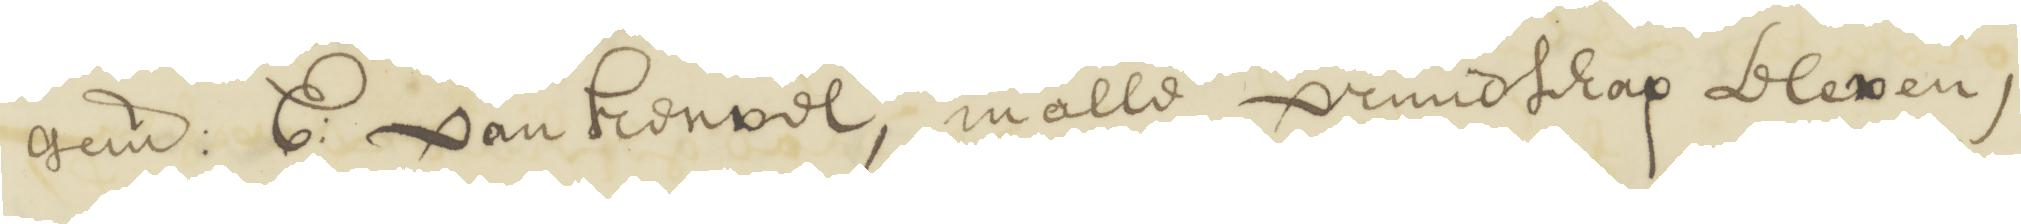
gem: E: van kervel, in alle vrundschap te leven,
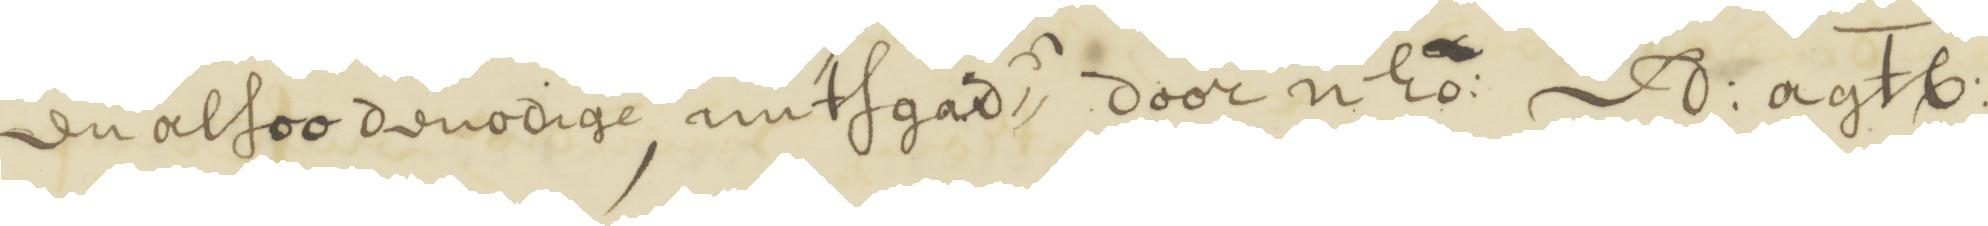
en alsoo de nodige, mitsgad„s door u ho: Ed: agtb
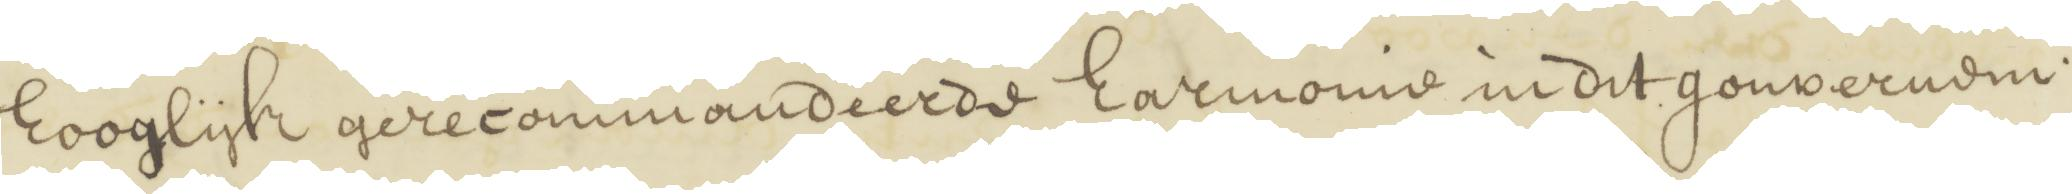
hooglijk gerecommandeerde harmonie in dit gouvernemt
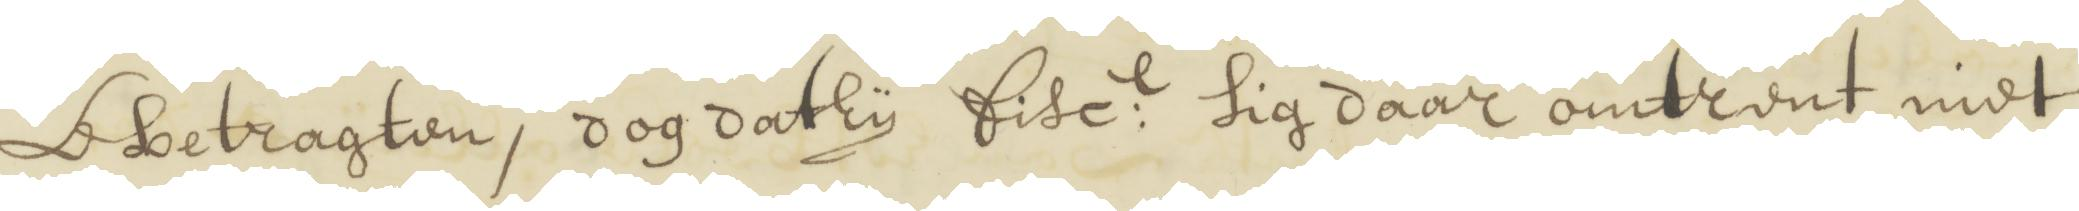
te betragten, dog dat hij fisc:l sig daar omtrent niet
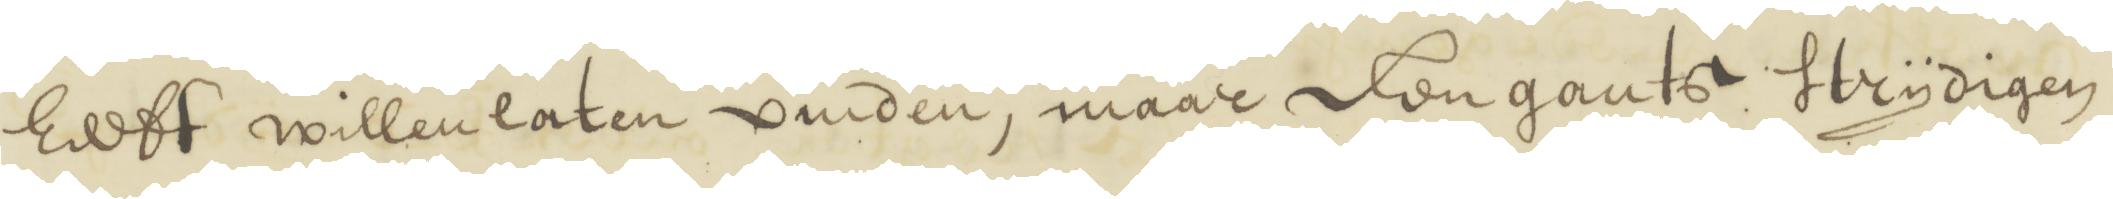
heeft willen laten vinden, maar Een gants strijdigen
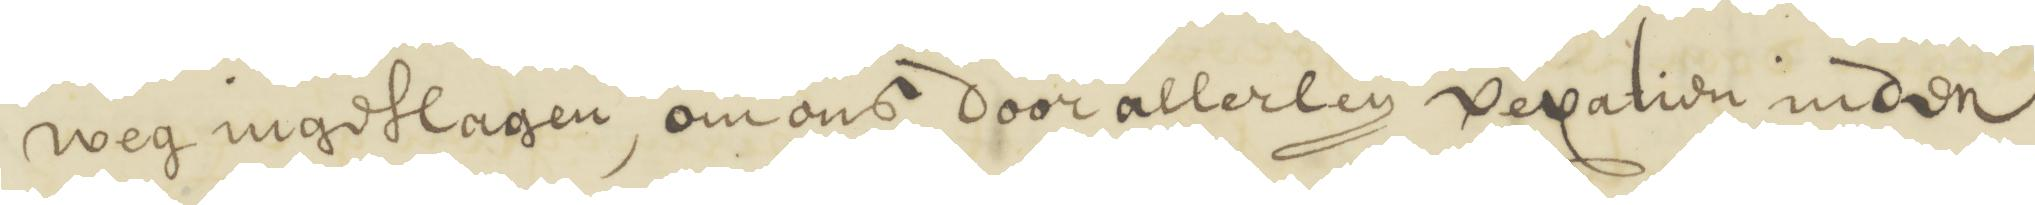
weg ingeslagen, om ons door allerley vexatien in den
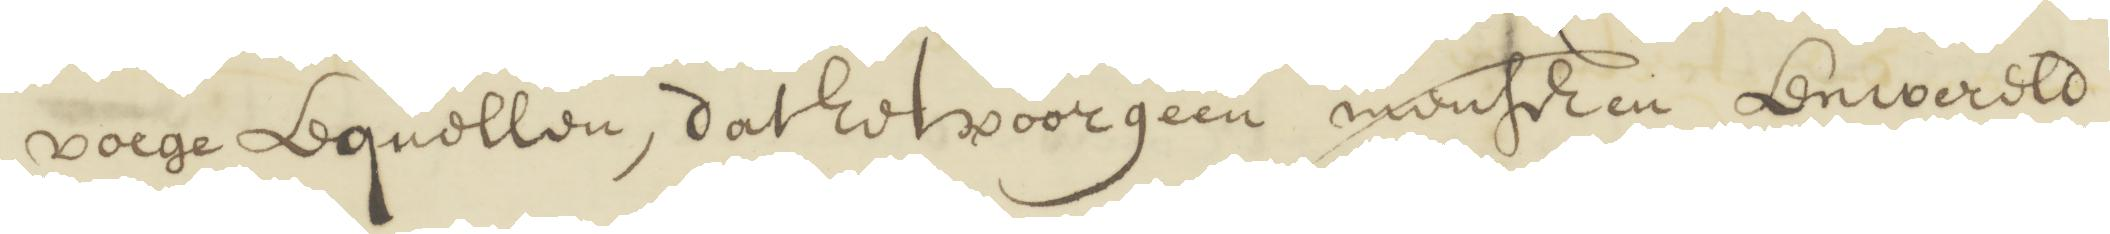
voege te quellen, dat het voor geen menschen ten wereld
